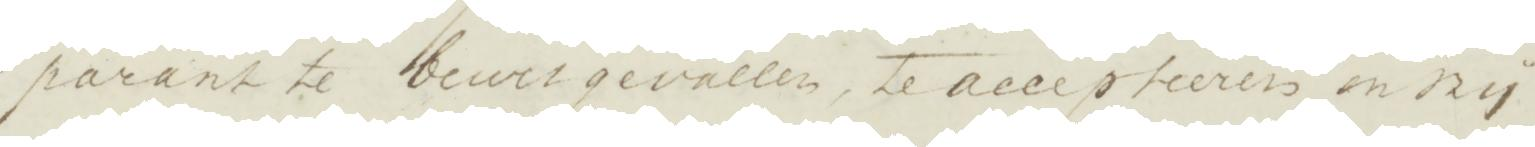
parant te beurt gevallen, te accepteeren en vrij
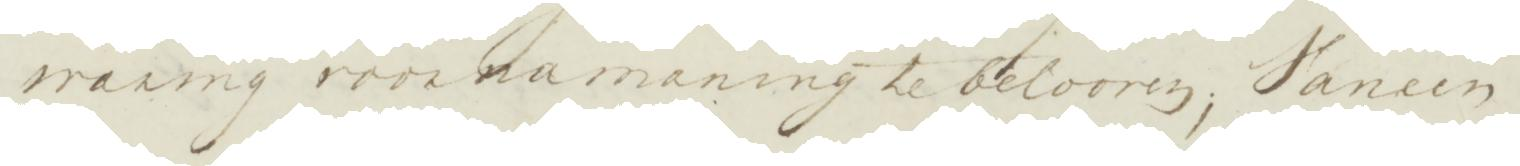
waring voor namaning te belooven; Van een
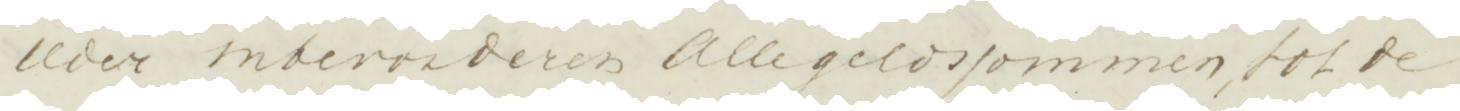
ieder in te vorderen alle geldssommen, tot de
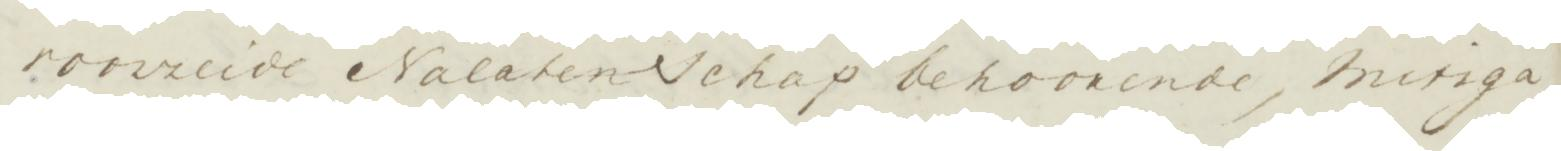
voorzeide Nalatenschap behoorende, mitsga
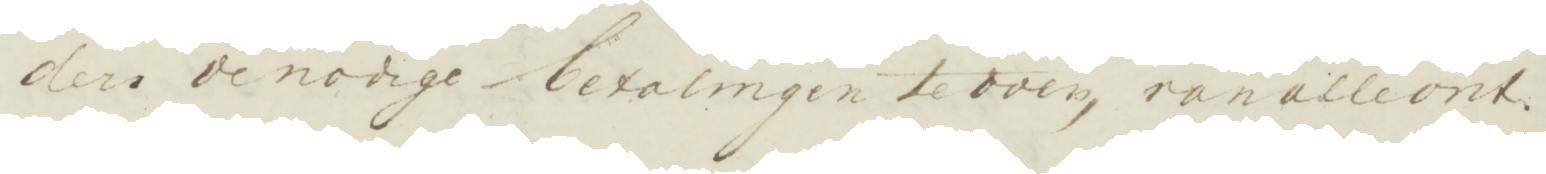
ders de nodige betalingen te doen, van alle ont„
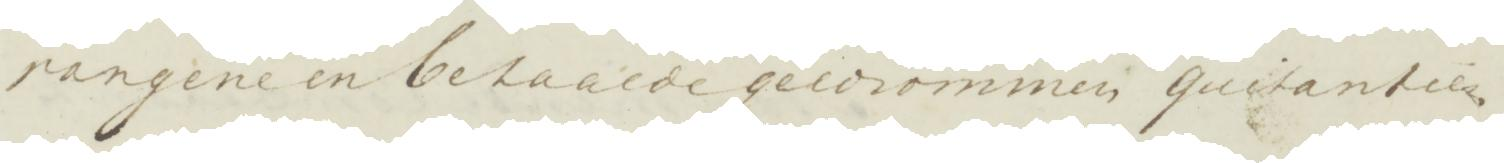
vangene en betaalde geldsommen quitantien
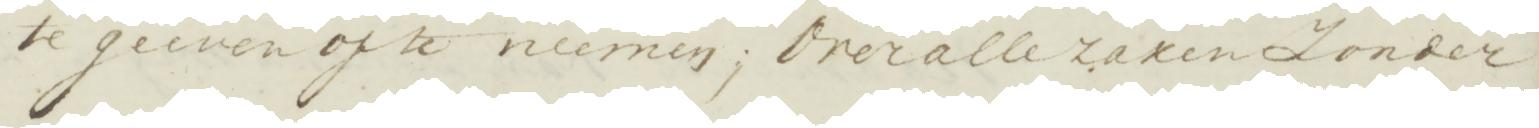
te geeven of te neemen; Over alle zaken zonder
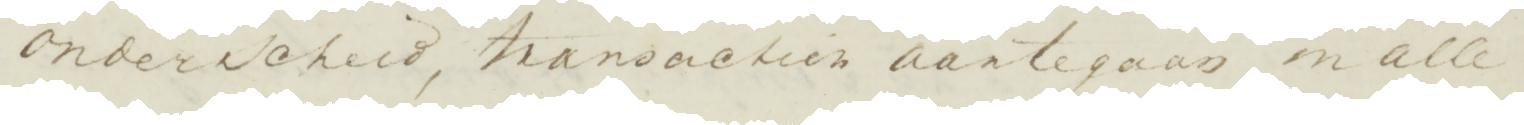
onderscheid, transactien aan tegaan, in alle
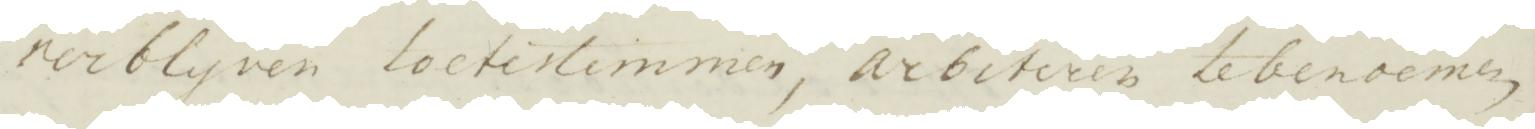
verblyven toe te stemmen, arbiteren te benoemen
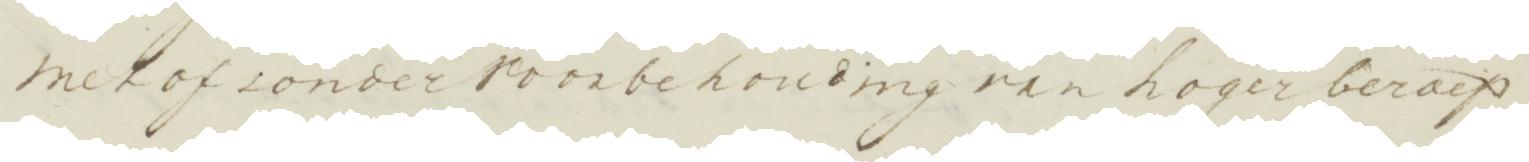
met of zonder voorbehouding van hoger beroep
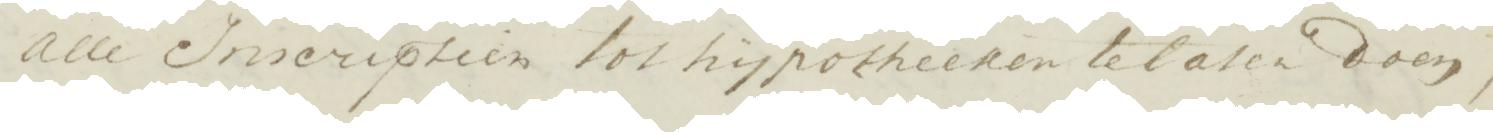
alle Inscriptien tot hijpotheeken te laten doen
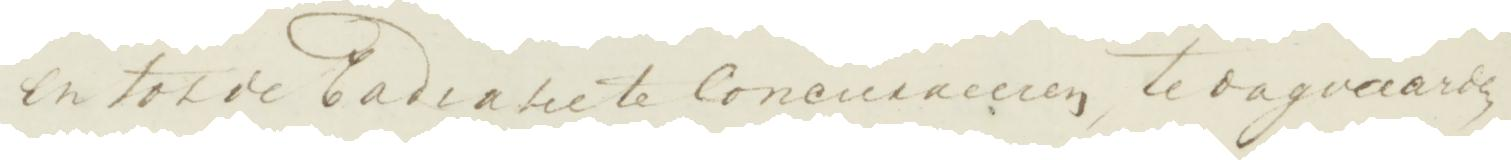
en tot de Radiatie te concurreeren, te dagvaarden
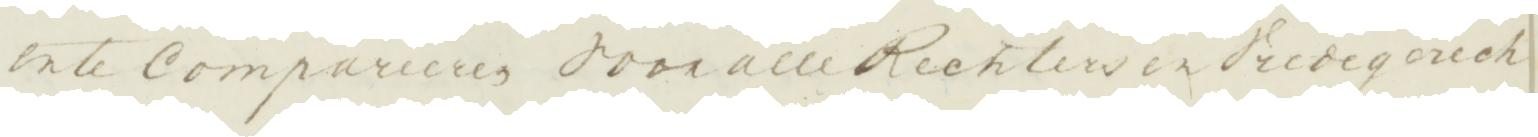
en te compareeren voor alle Rechters en Vredegerech
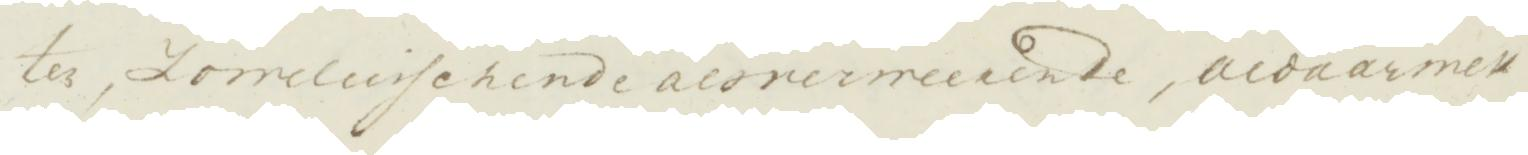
ten, zowel eischende als verweerende, aldaar met
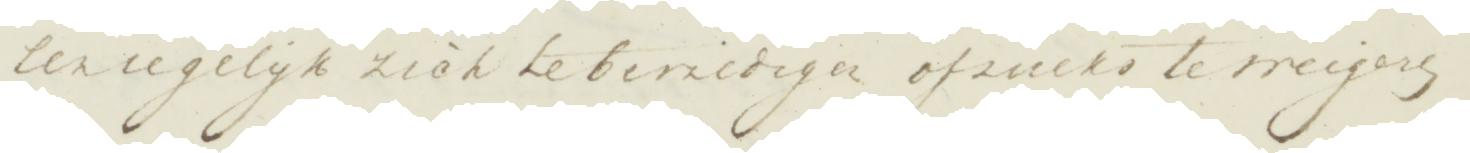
een iegelijk zich te bevredigen of zulks te weigeren
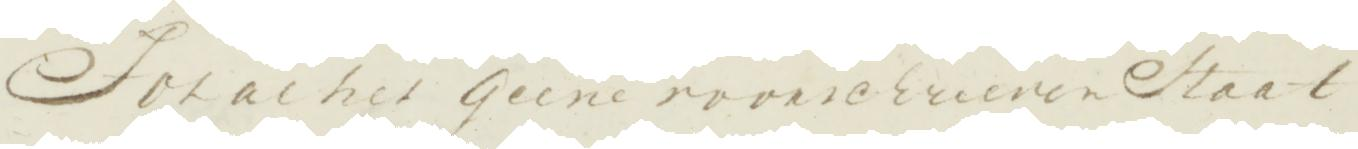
Tot al het Geene voorschreeven staat
